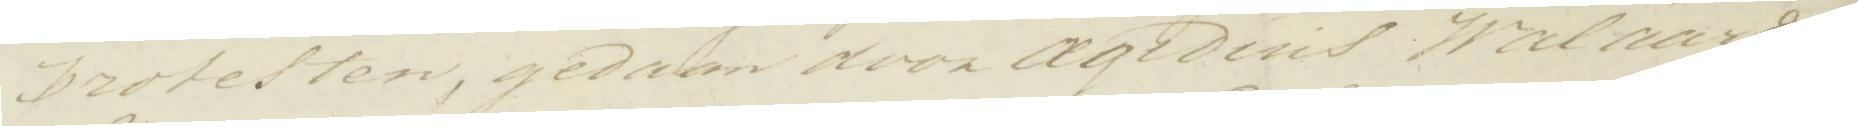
protesten, gedaan door AEgidius Walaardt
